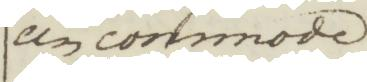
een commode
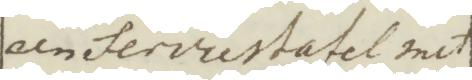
een Serviestafel met
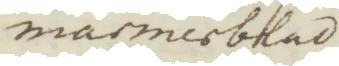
marmerblad
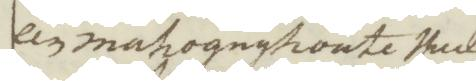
een mahognyhoute speel
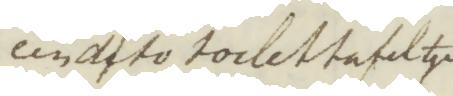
een dito toilettafeltje
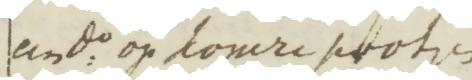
een d:o op kopere pootjes
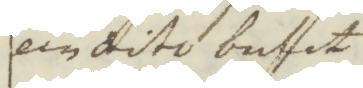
een dito buffet
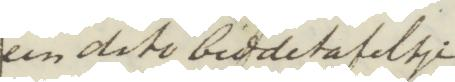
een dito biddetafeltje
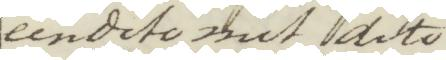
Een dito met dito
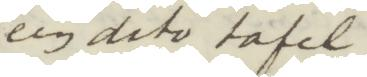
een dito tafel
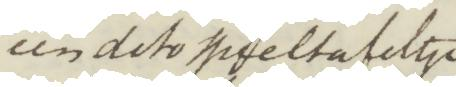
een dito speeltafeltje
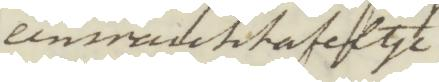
een waschtafeltje
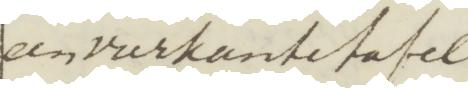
een vierkante tafel
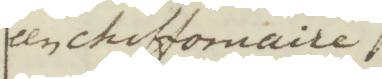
een chiffornaire
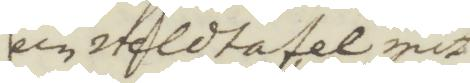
een veldtafel met
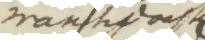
wanthdoek
